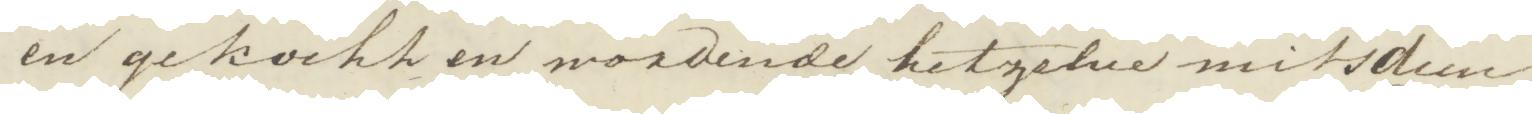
en gekocht en wordende hetzelve mitsdien
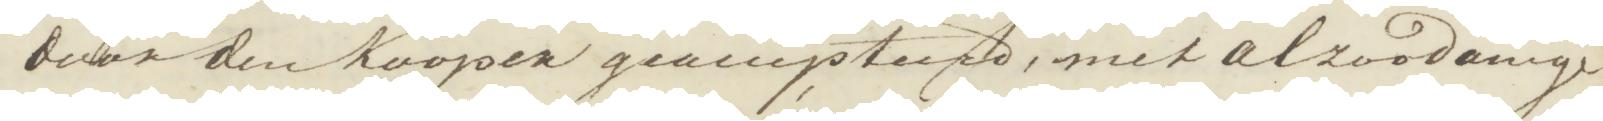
door den kooper geaccepteerd, met alzoodanige
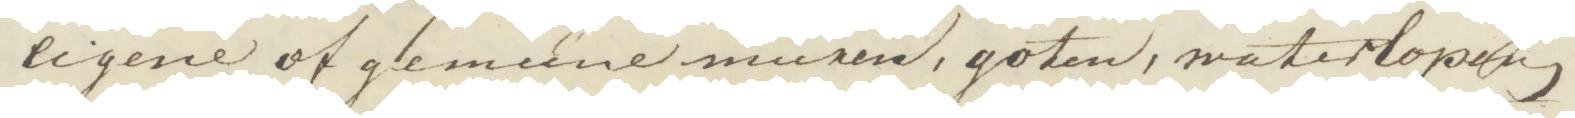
eigene of gemeene muren, goten, waterlopen
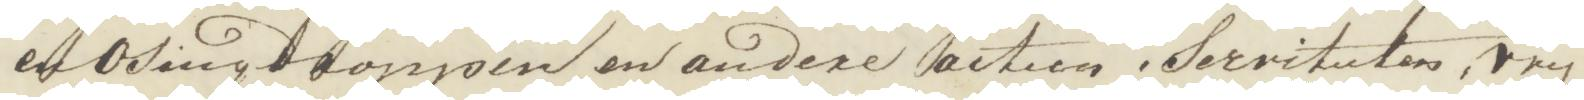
en Osingdroppen en andere actien, servituten, vry
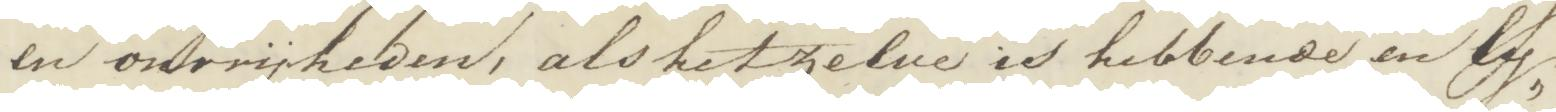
en onvrijheden, als hetzelve is hebbende en ly„
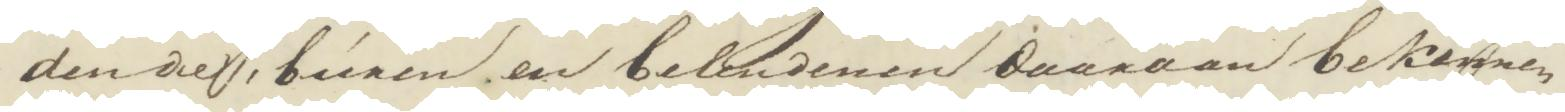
den die, buren en belendenen daaraan bekennen
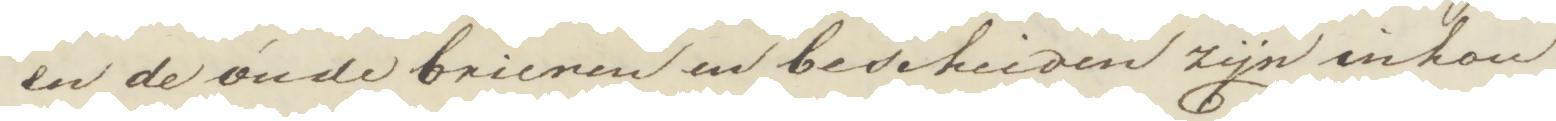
en de oude brieven en bescheiden zijn inhou
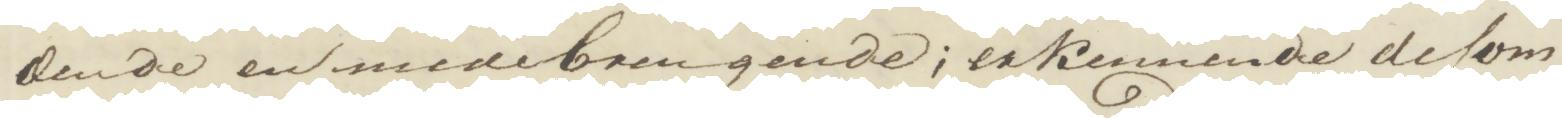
dende en medebrengende; erkennende de Com
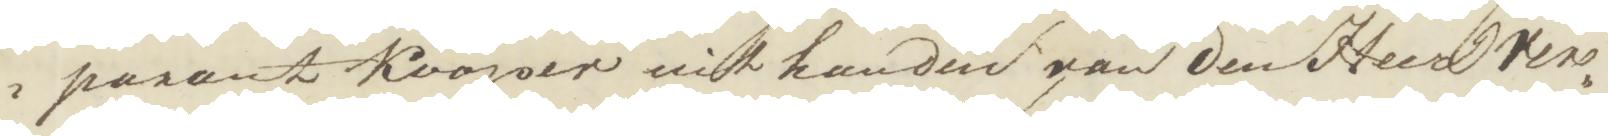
„parant kooper uit handen van den Heer ver„
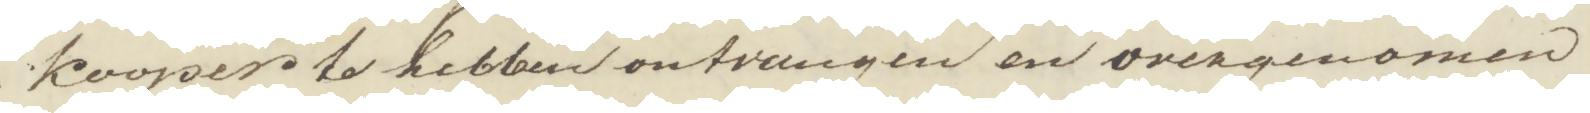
„kooper te hebben ontvangen en overgenomen
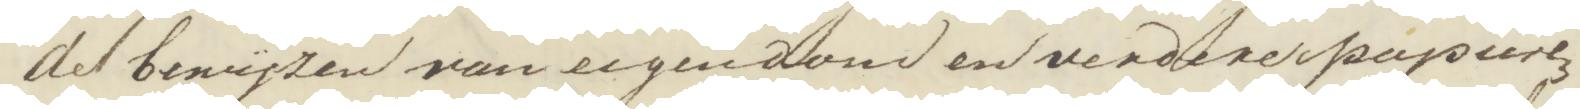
de bewijzen van eigendom en verdere papieren
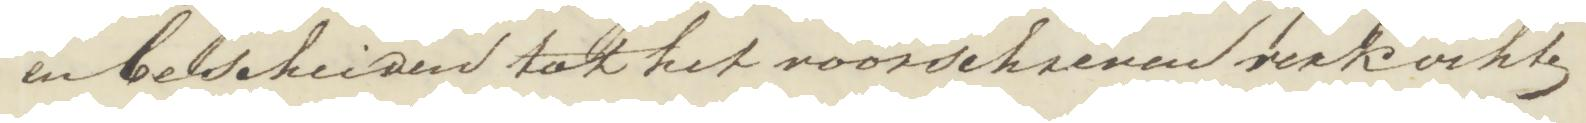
en bescheiden tot het voorschreven verkochte
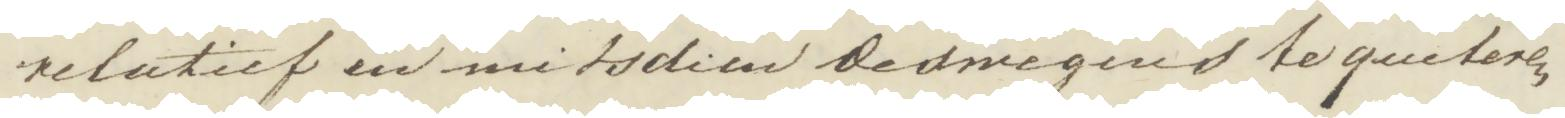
relatief en mitsdien deswegens te quiteren
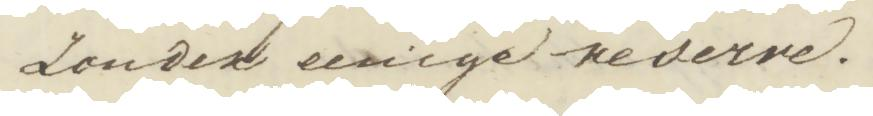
zonder eenige reserve.
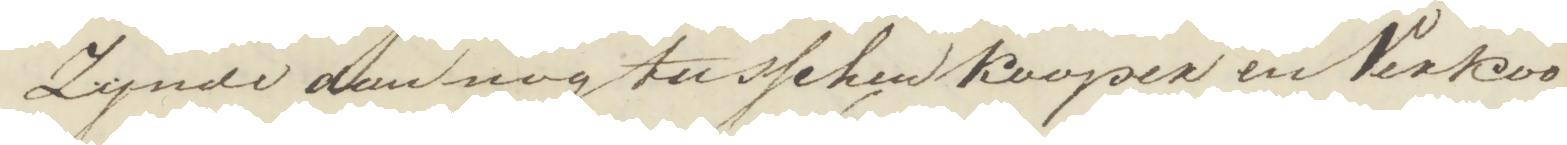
Zijnde dan nog tusschen kooper en Verkoo
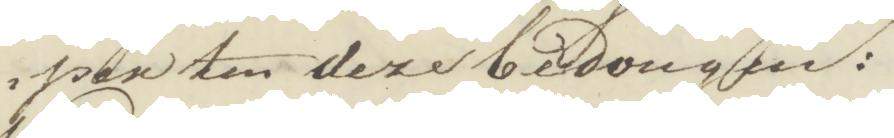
„per ten deze bedongen:
